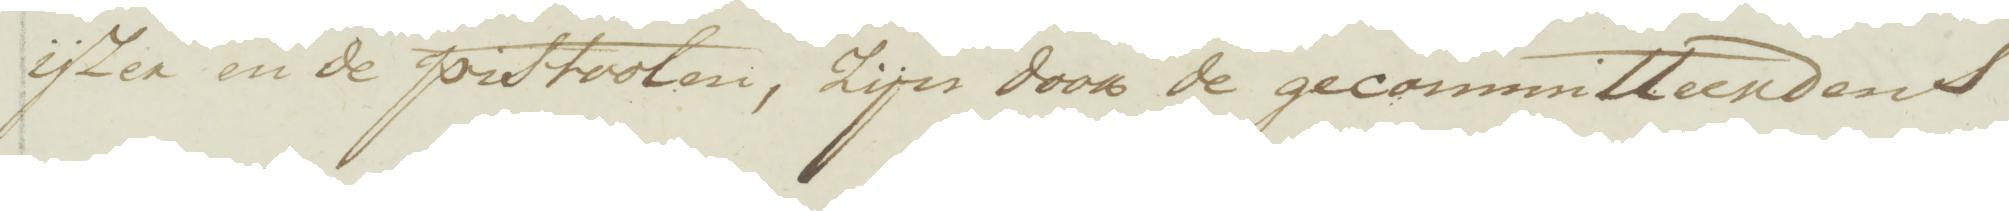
ijzer en de pistoolen, zijn door de gecommitteerdens
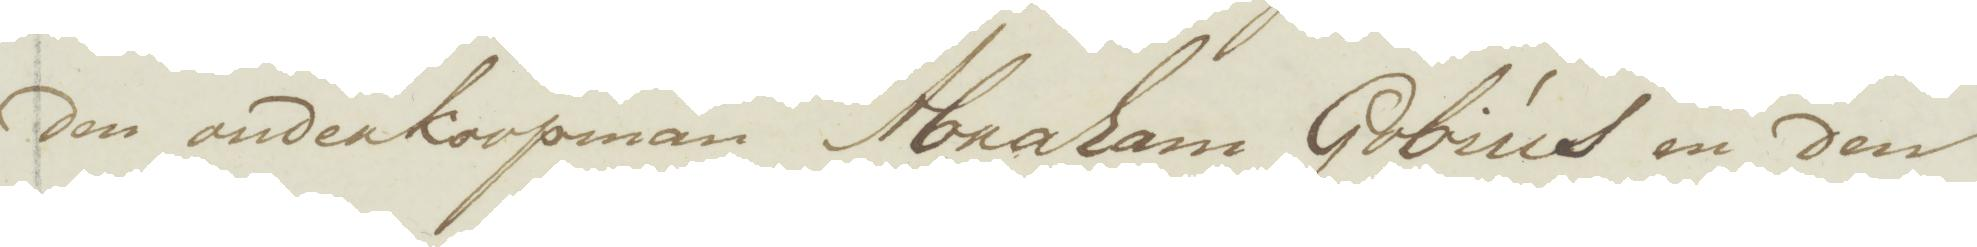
den onderkoopman Abraham Gobius en den
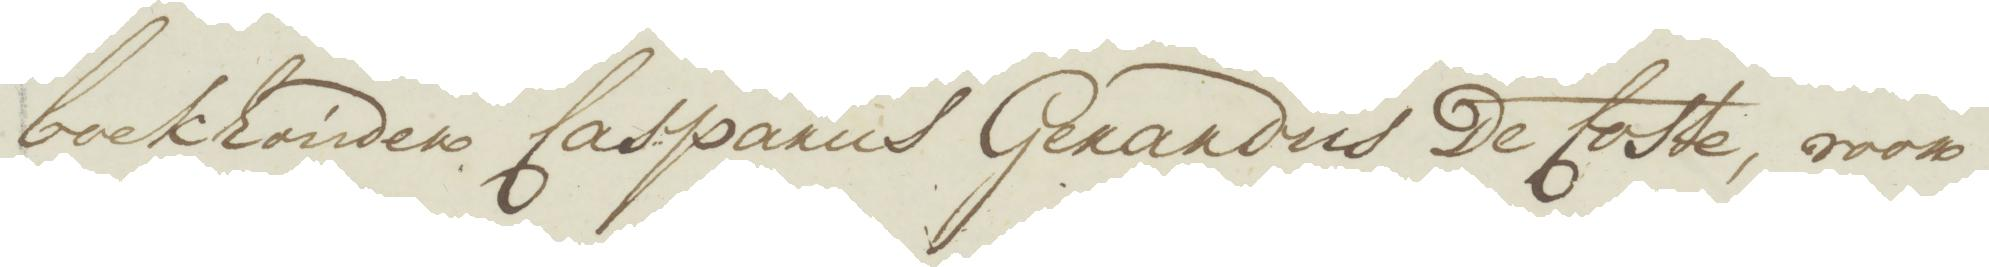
boekhouder Casparus Gerardus De Coste, voor
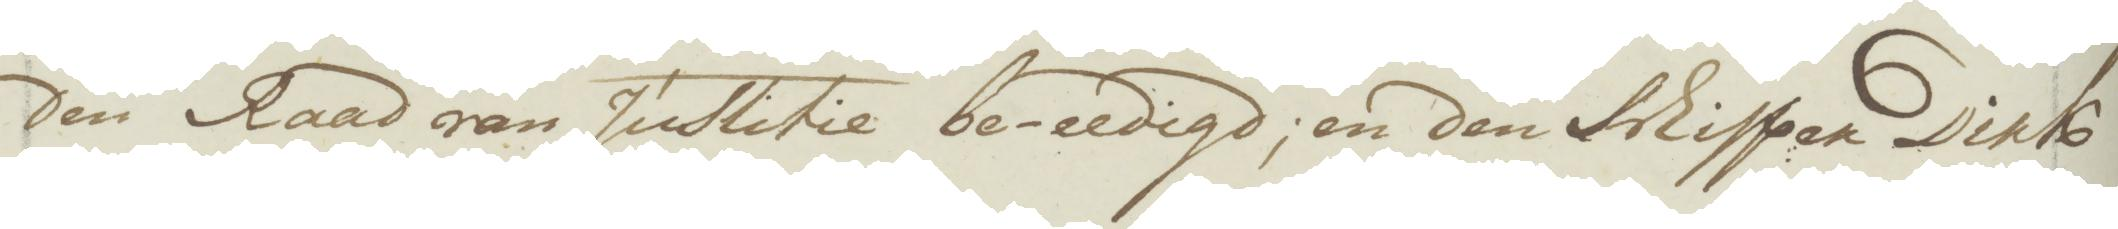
den Raad van Justitie be-eedigd; en den schipper Dirk
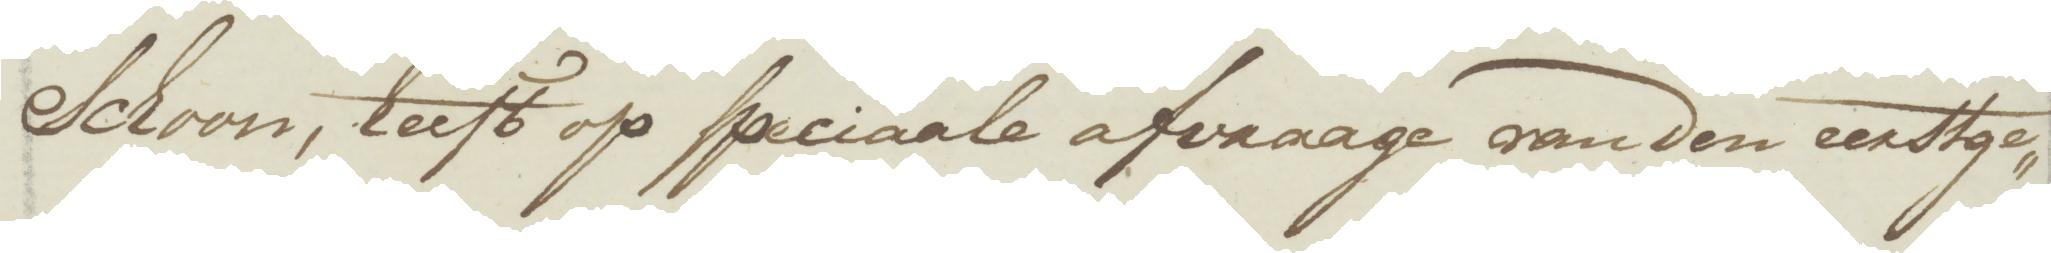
Schoon, heeft op speciaale afvraage van den eerstge„
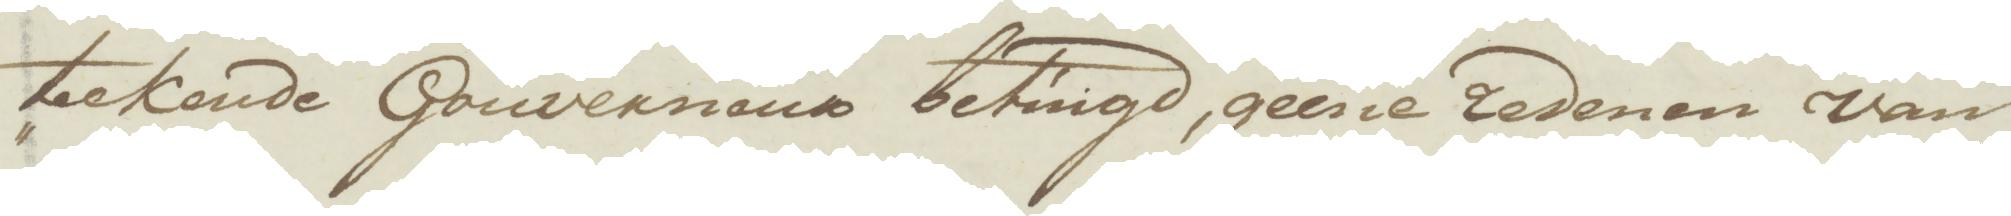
„teekende Gouverneur betuigd, geene redenen van
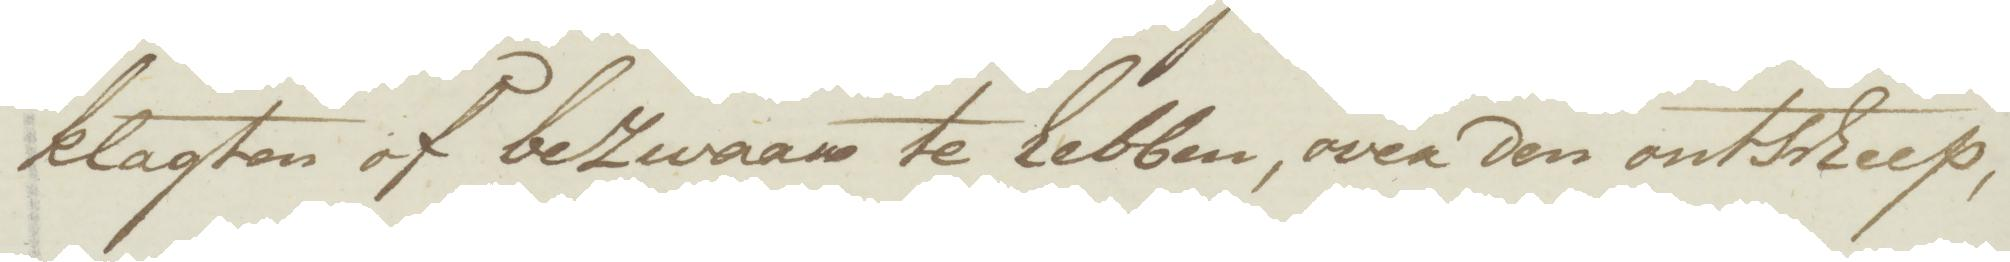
klagten of bezwaar te hebben, over den ontscheep,
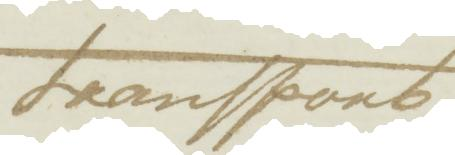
transport
